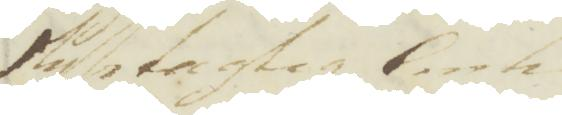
Vijf tagtig Cents
